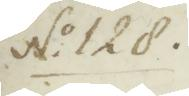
N:o 128.
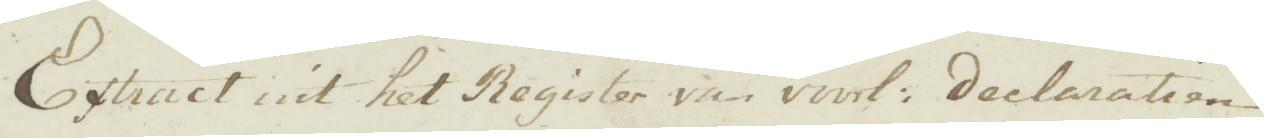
Extract uit het Register van voorl: declaratien
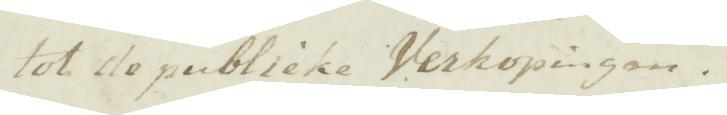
tot de publieke Verkopingen.
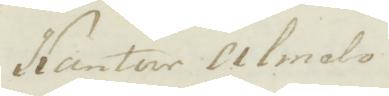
Kantoor Almelo
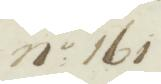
N:o 161
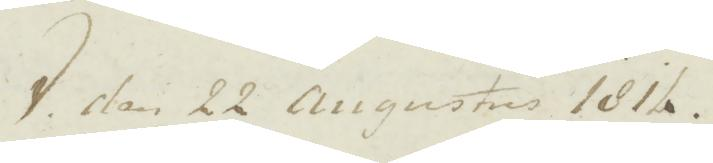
V. den 22 Augustus 1814.
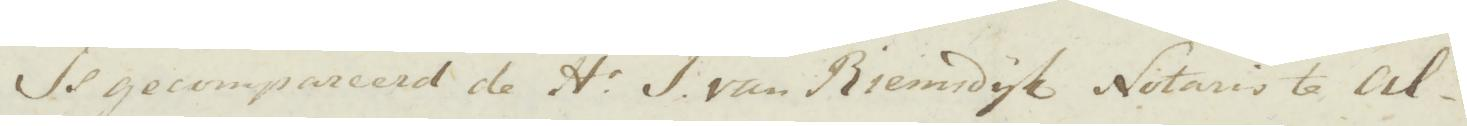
Is gecompareerd de H.r I. van Riemsdijk Notaris te Al=
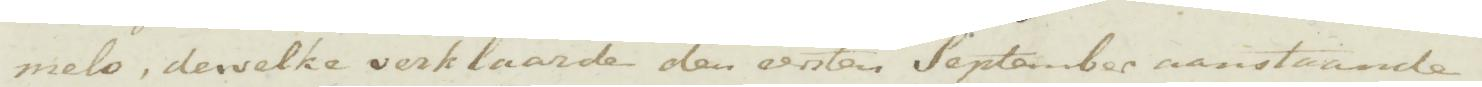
melo, dewelke verklaarde den eersten September aanstaande
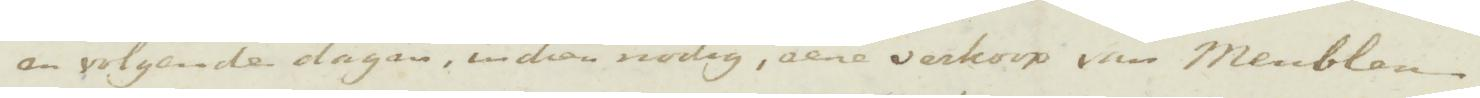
en volgende dagen, indien nodig, eene verkoop van Meublen
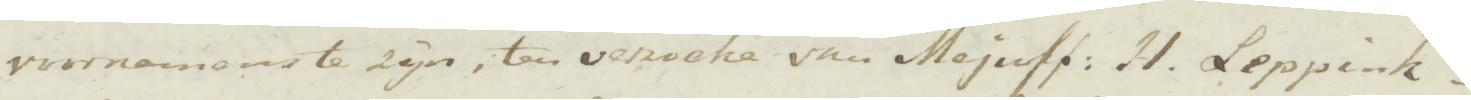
voornemens te zijn, ten verzoeke van Mejuff: H. Leppink-
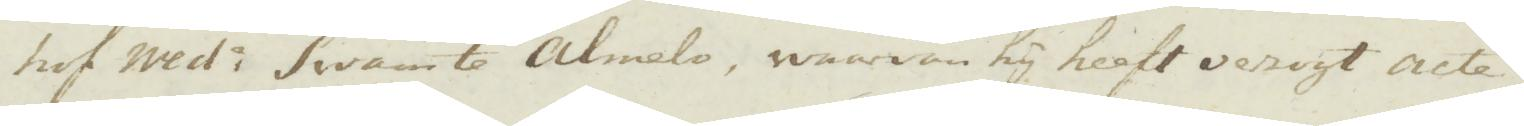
hof wed:e Swam te Almelo, waarvan hij heeft verzogt acte
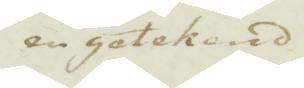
en getekend
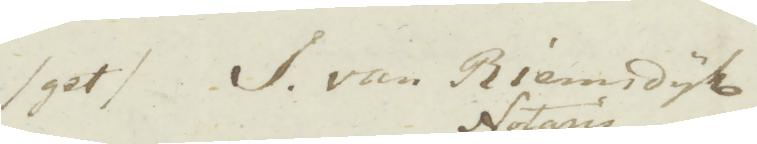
/get/ I. van Riemsdijk
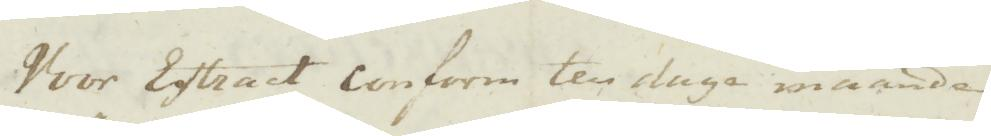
Voor Extract conform ten dage maande
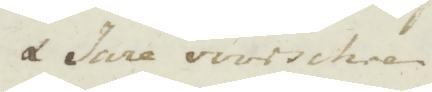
& Iare voorschre
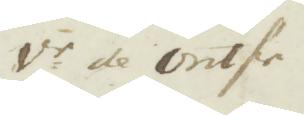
V=r de Ontfr
